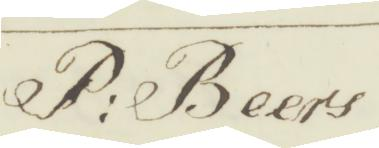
P: Beers
